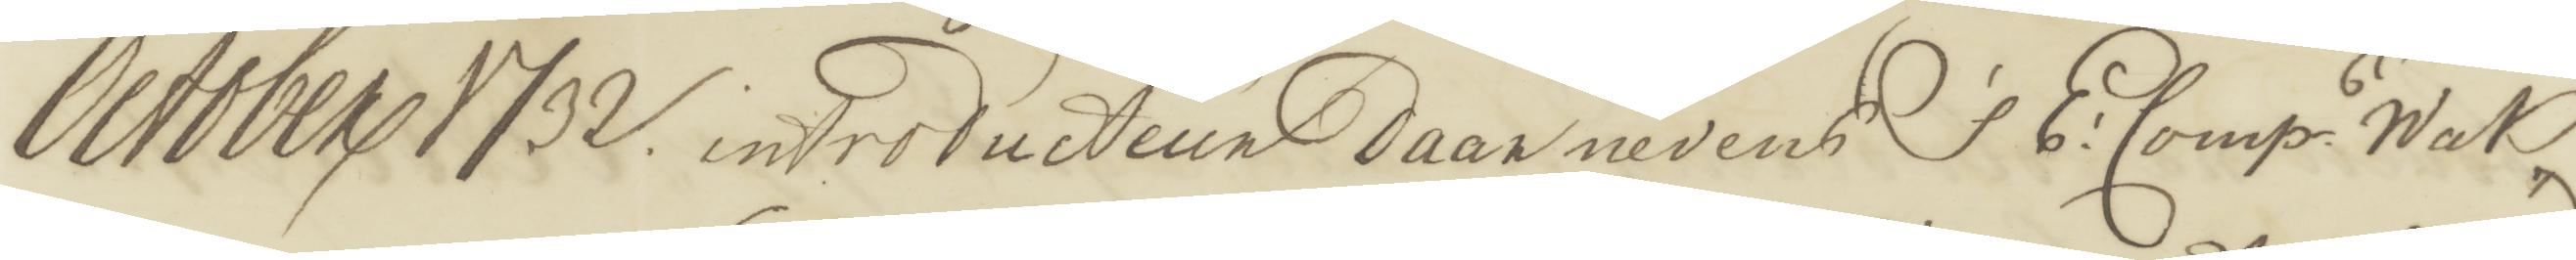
October 1732. introducteur daar nevens 'S E: Comp:s wak
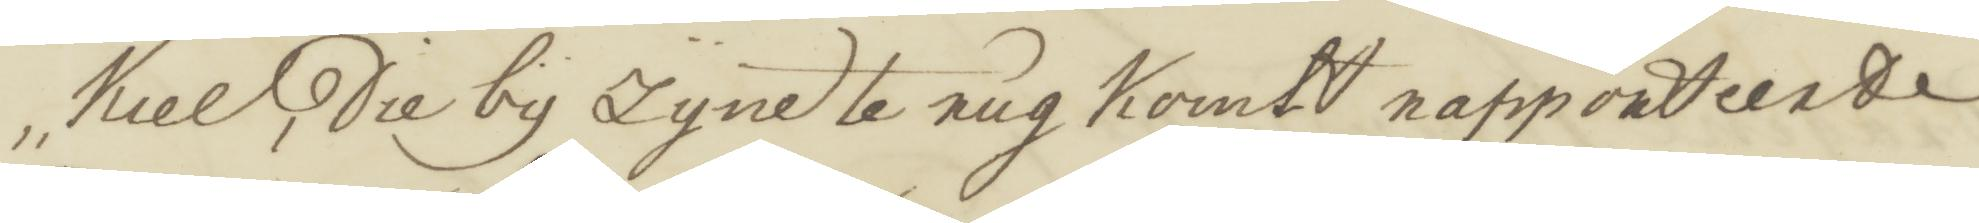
„kiel, die bij zijne te rug komst rapporteerde
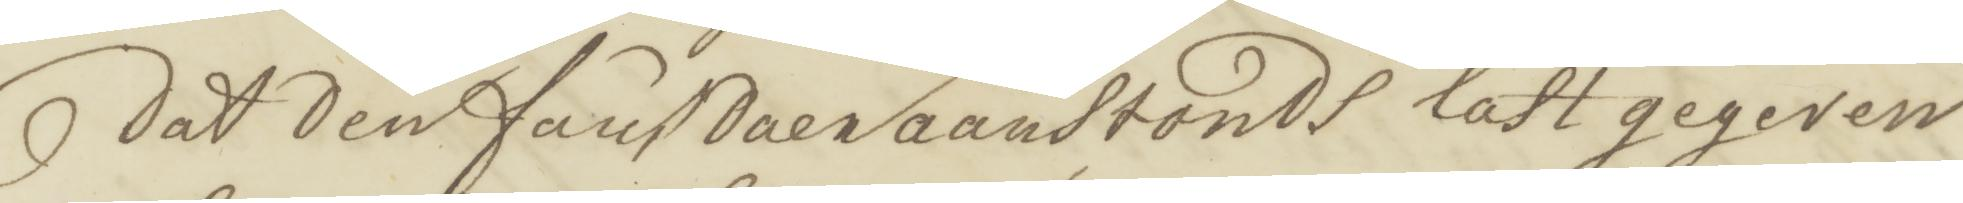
dat den fausdaer aanstonds last gegeven
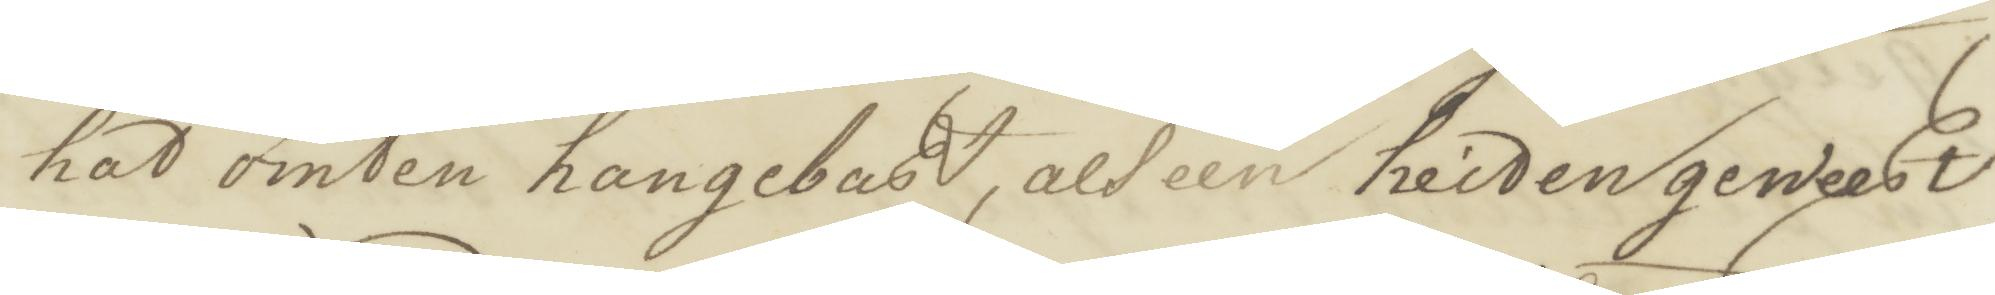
had om den hangebast, als een heiden geweest
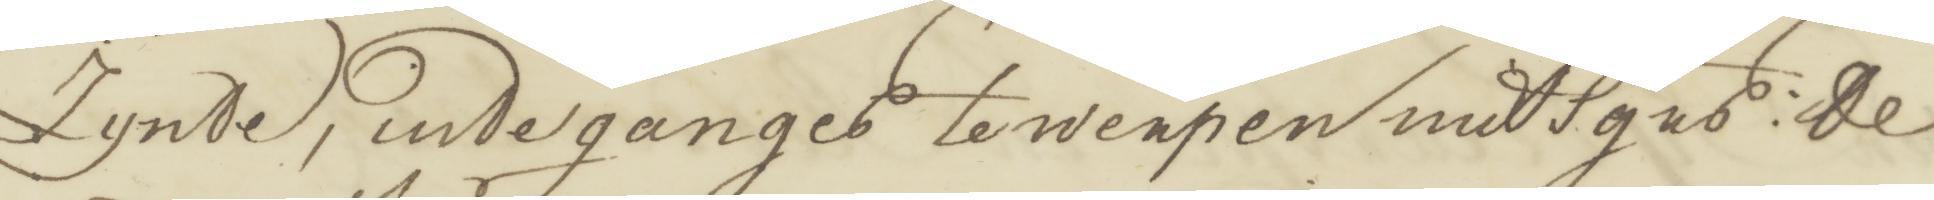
Zijnde, inde ganges te werpen mitsgrs: de
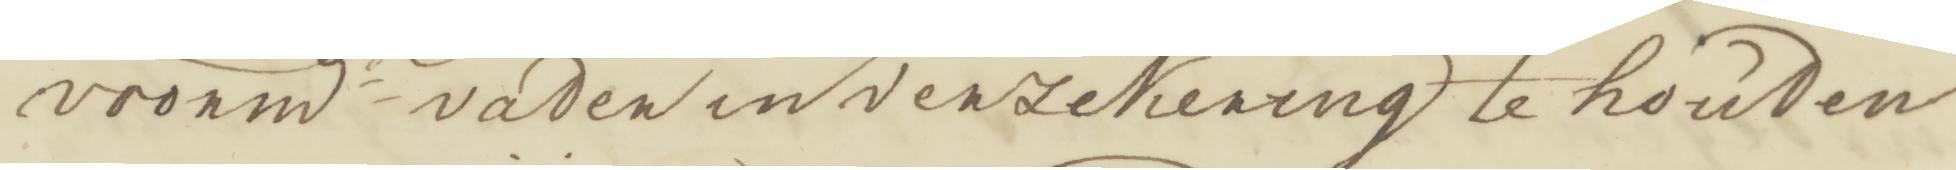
voorm:te vader in verzekering te houden
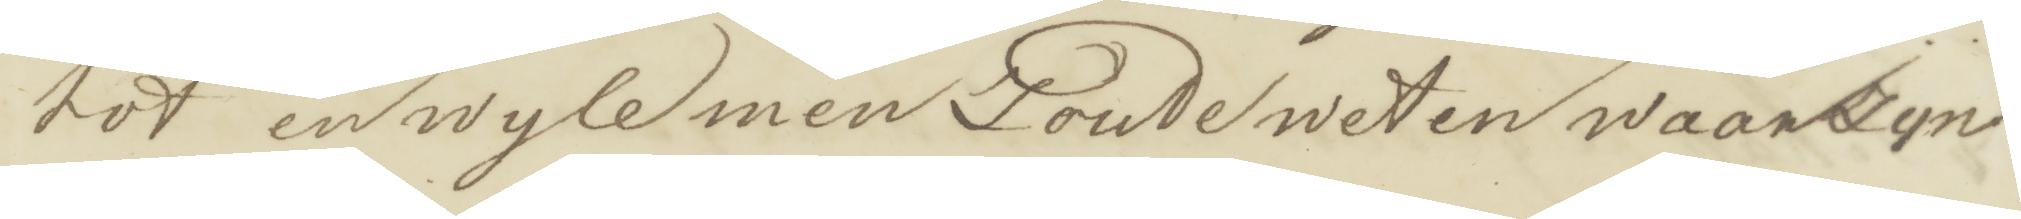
tot en wijle men Zoude weten waar zijn
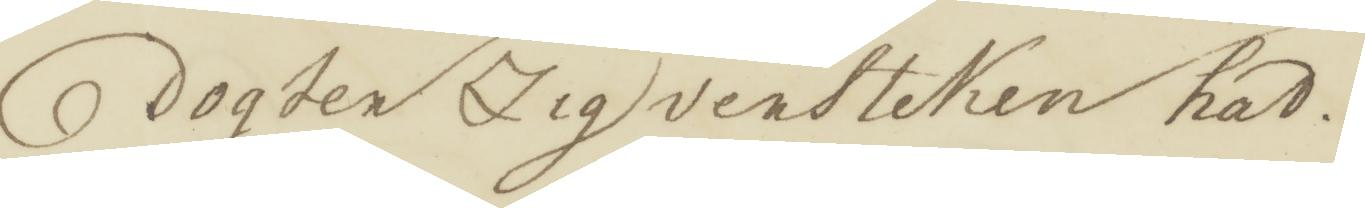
dogter Zig versteken had.
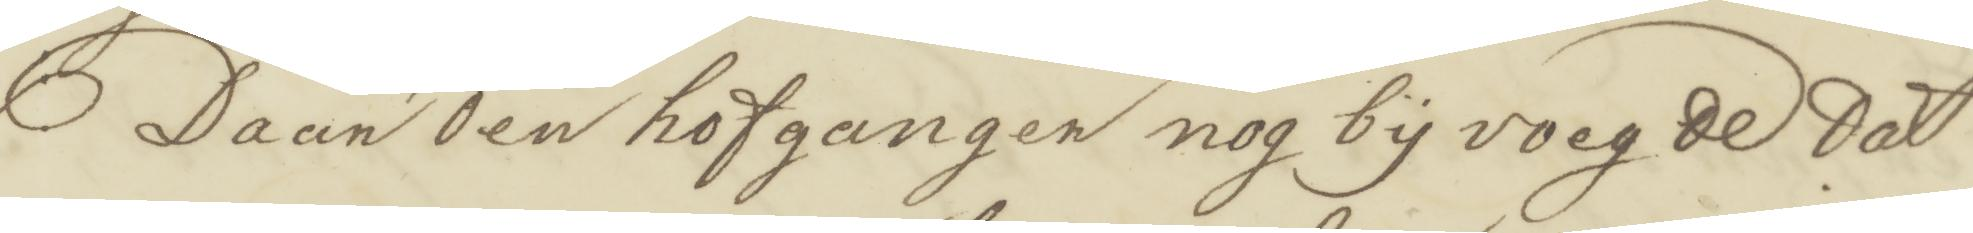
Daar den hofganger nog bij voegde dat
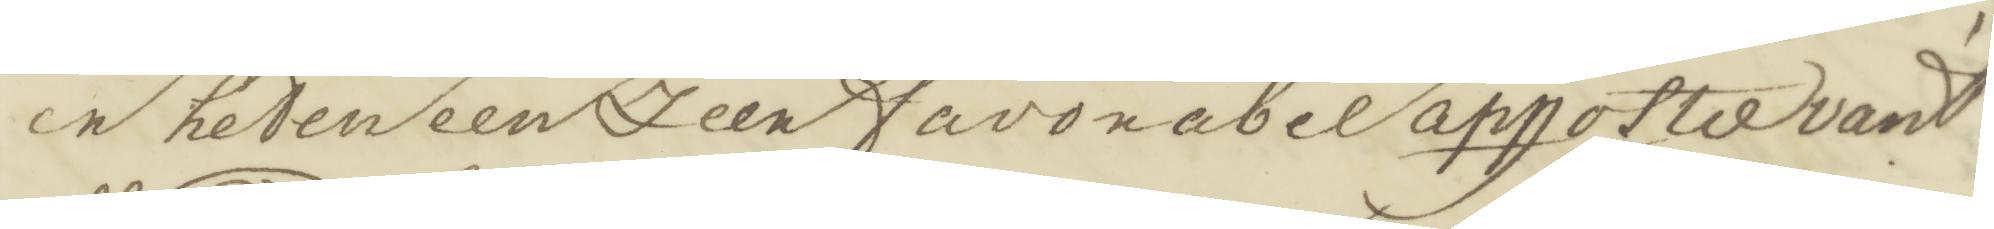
er heden een zeer favorabel appostie van't
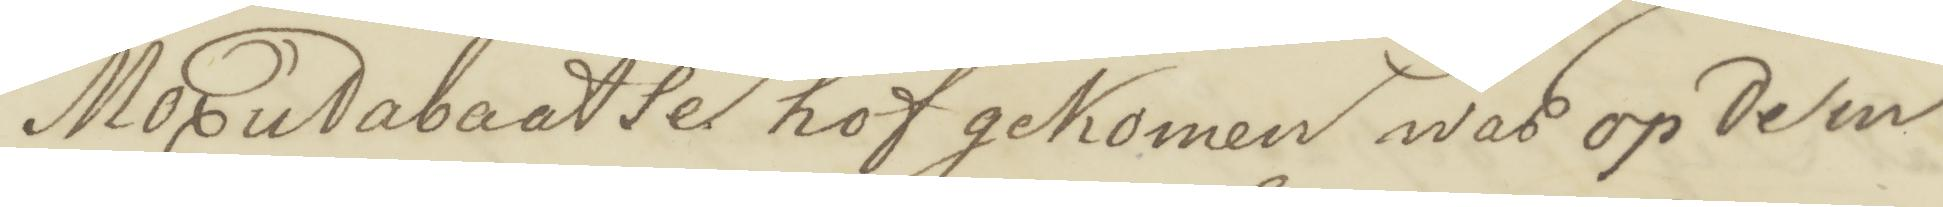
Moxudabaatses hof gekomen was op de in
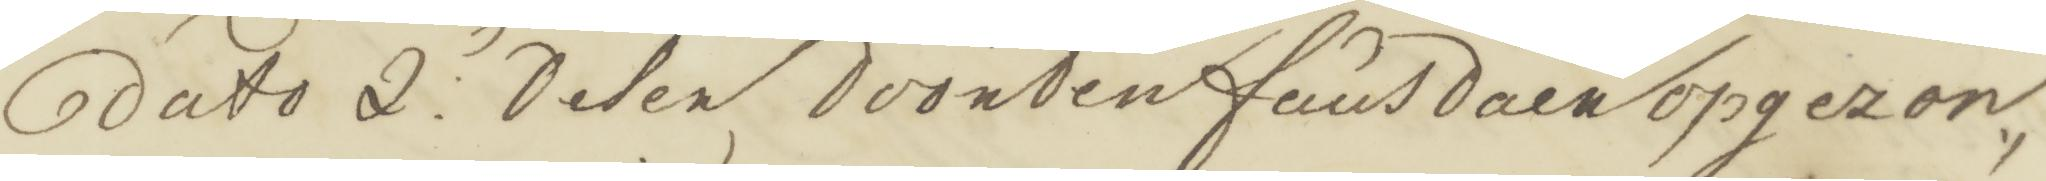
dato 2:' deser door den fausdaer opgezon„
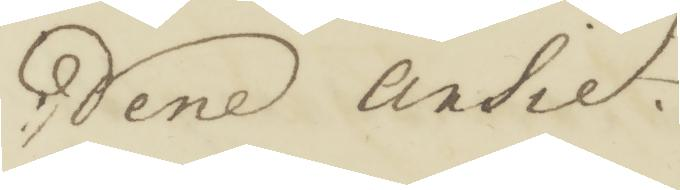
„dene arsie:
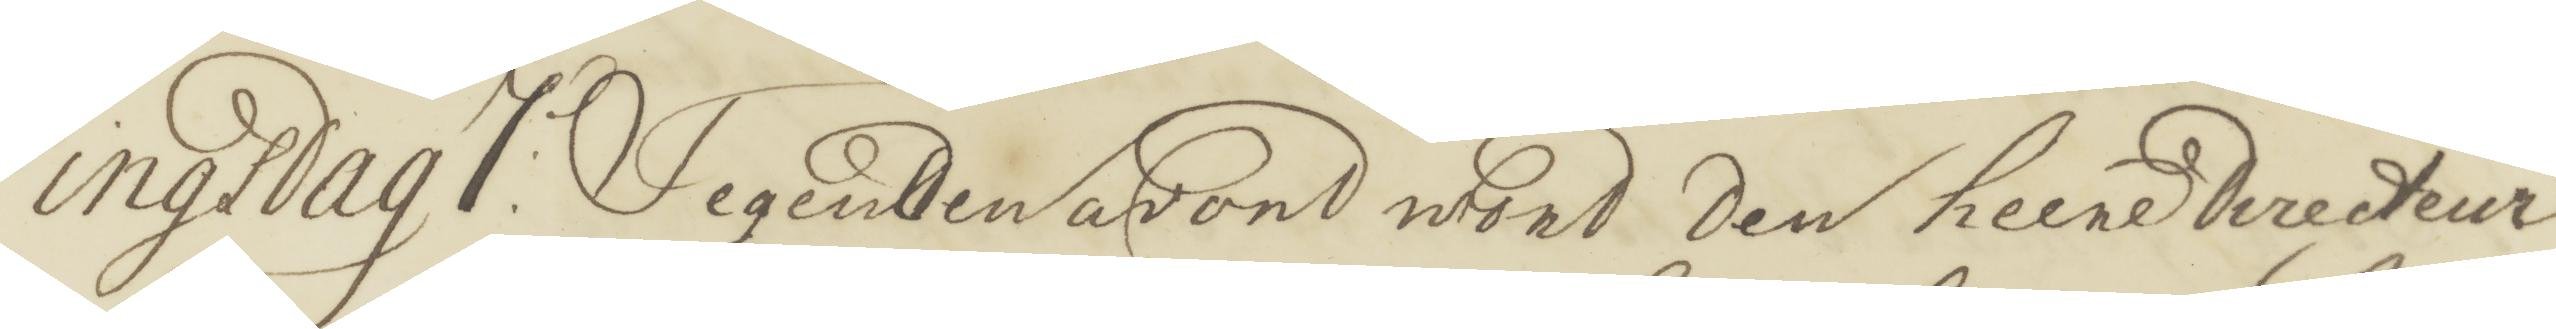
Dingsdag 7:e : Tegen den avond word den heere directeur
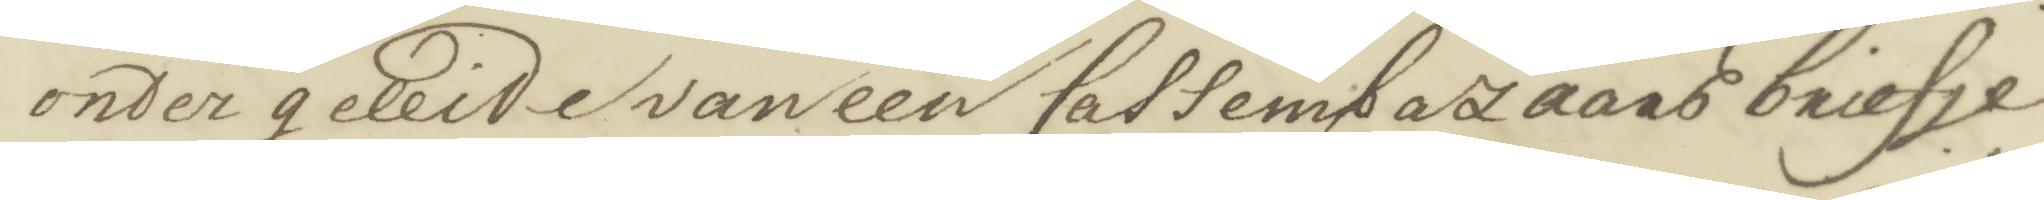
onder geleide van een Cassembazaars briefje
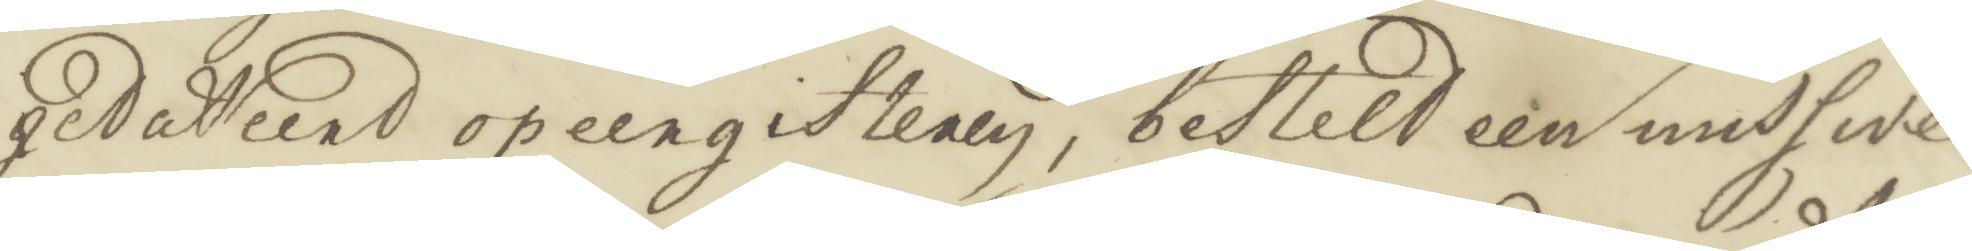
gedateerd op eergisteren, besteld een missive
